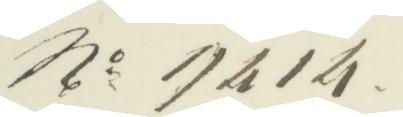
N=o 7414.
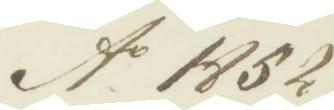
A.o 1854
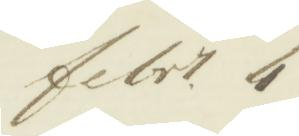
febr.y 4
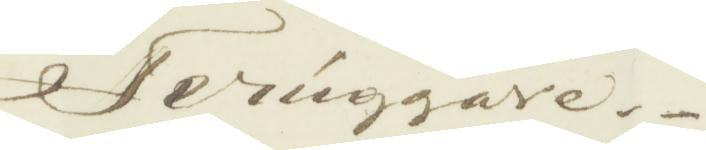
Teruggave. –
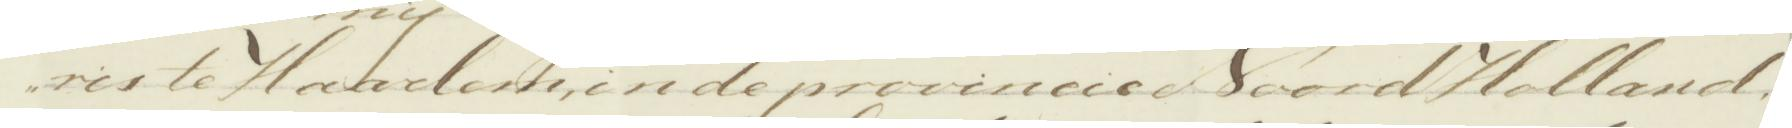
„ris te Haarlem, in de provincie Noord Holland,
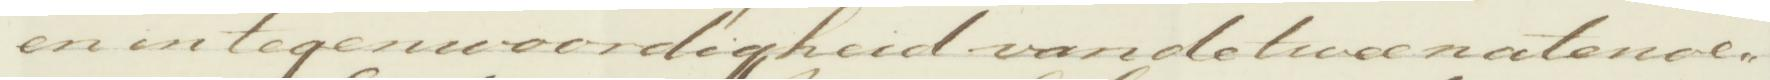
en in tegenwoordigheid van de twee natenoe„
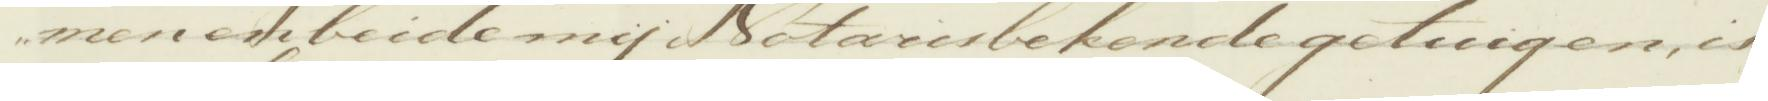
„menen beide mij Notaris bekende getuigen, is
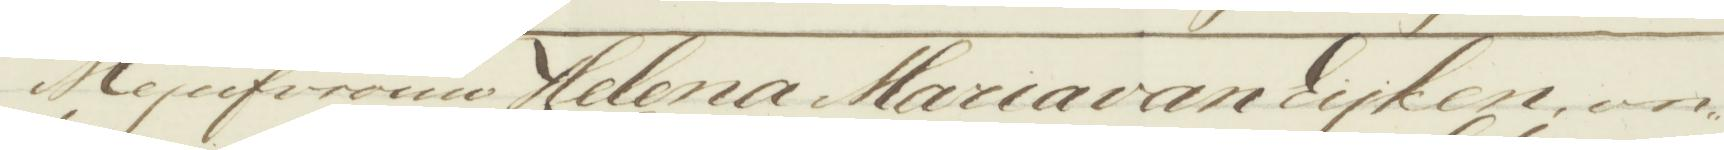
Mejufvrouw Helena Maria van Eijken, on„
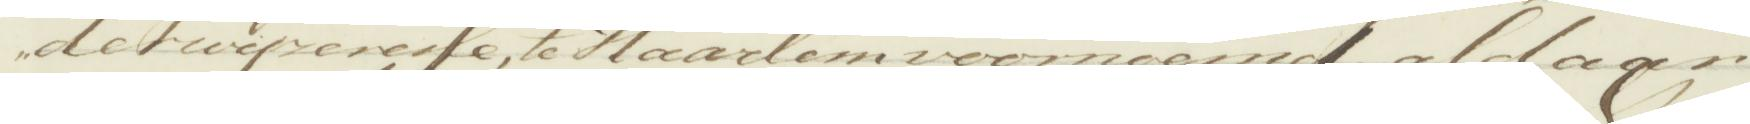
„derwijzeresse, te Haarlem voornoemd, aldaar
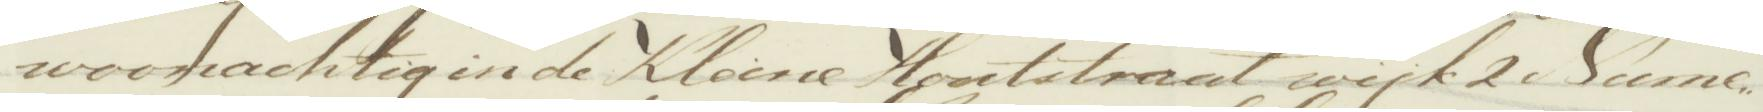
woonachtig in de Kleine Houtstraat wijk 2 Nume„
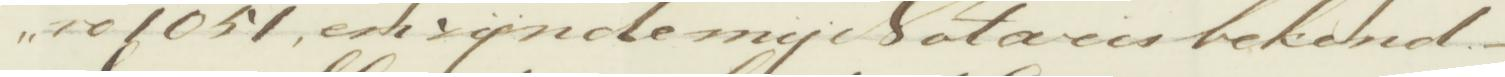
„ro 1051, en zijnde mij Notaris bekend.
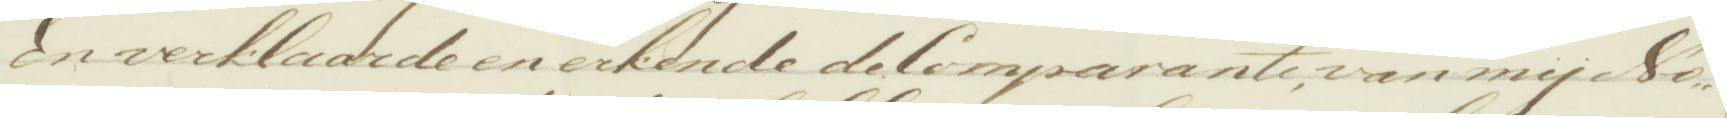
en verklaarde en erkende de Comparante, van mij No„
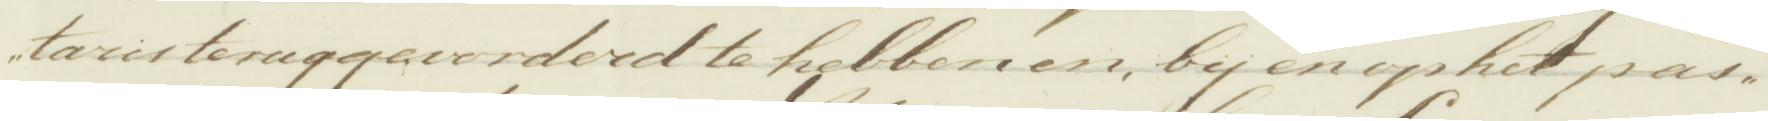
„taris teruggevorderd te hebben en, bij en op het pas„
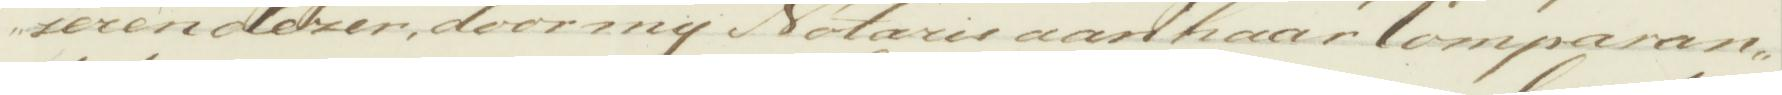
„seren dezer, door mij Notaris aan haar Comparan„
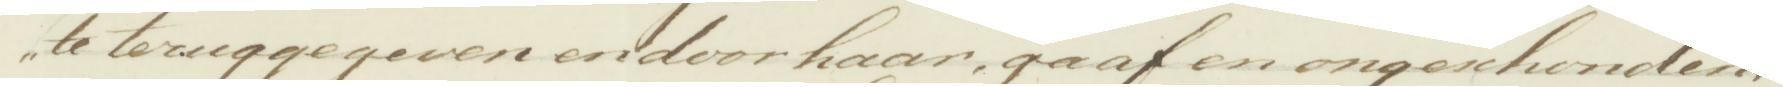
„te teruggegeven en door haar, gaaf en ongeschonden,
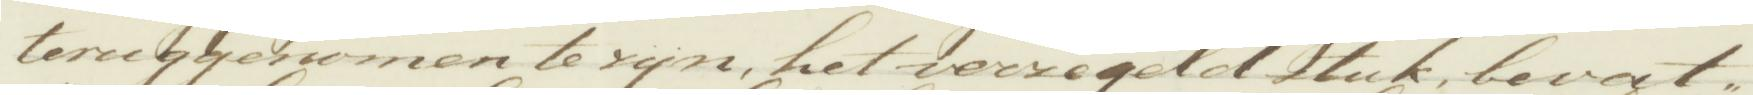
teruggenomen te zijn, het verzegeld stuk, bevat„
